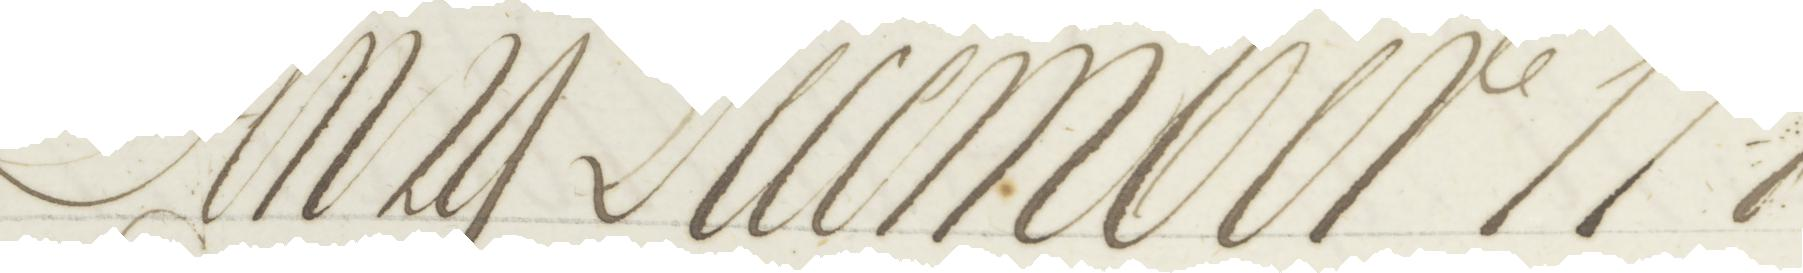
Den 29 December 1781
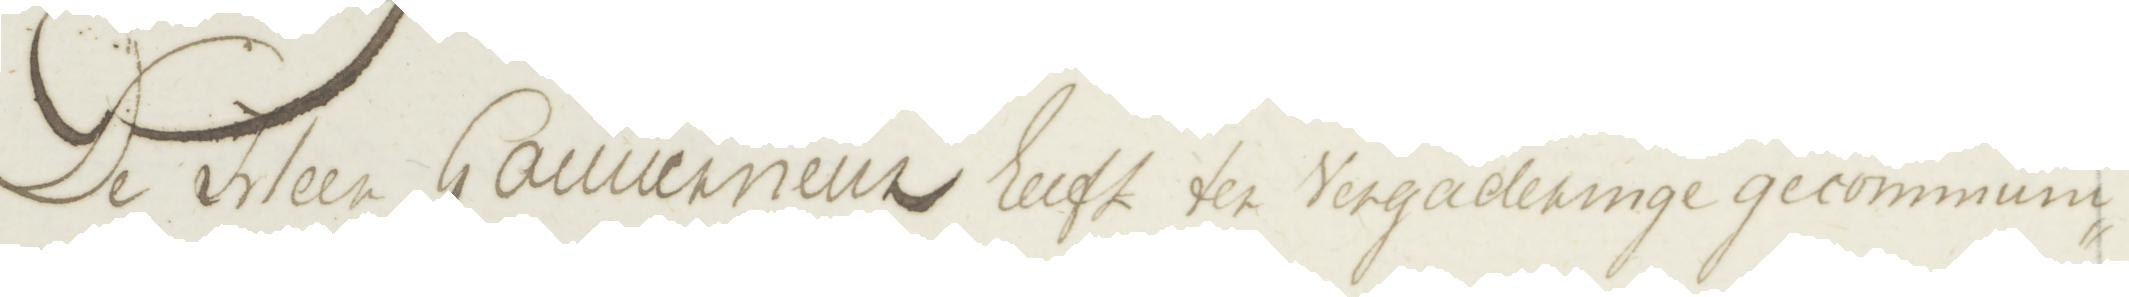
De Heer Gouverneur heeft ter vergaderinge gecommuni„
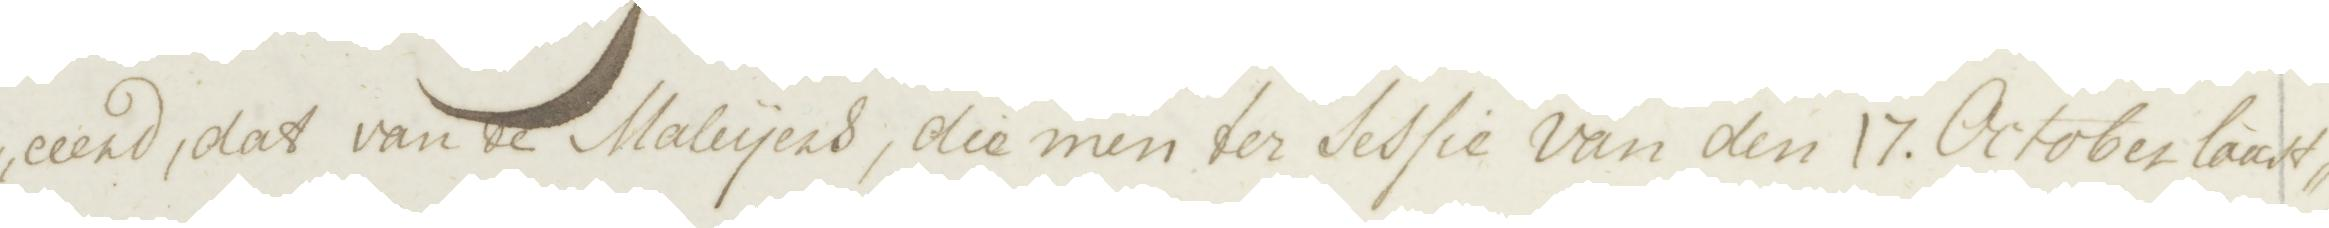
"ceerd, dat van de Maleijers, die men ter Sessie van den 17. October laast
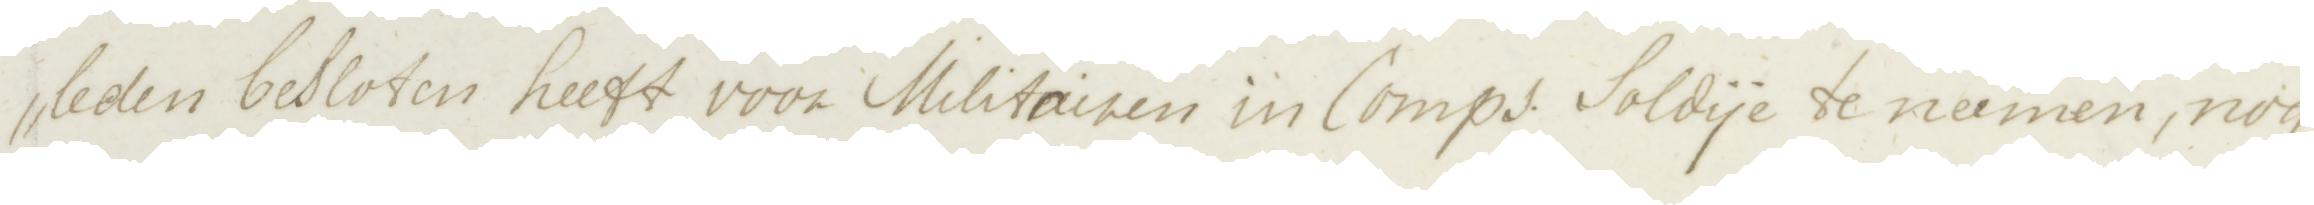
„leden besloten heeft voor Militairen in Comps. Soldije te nemen, nog
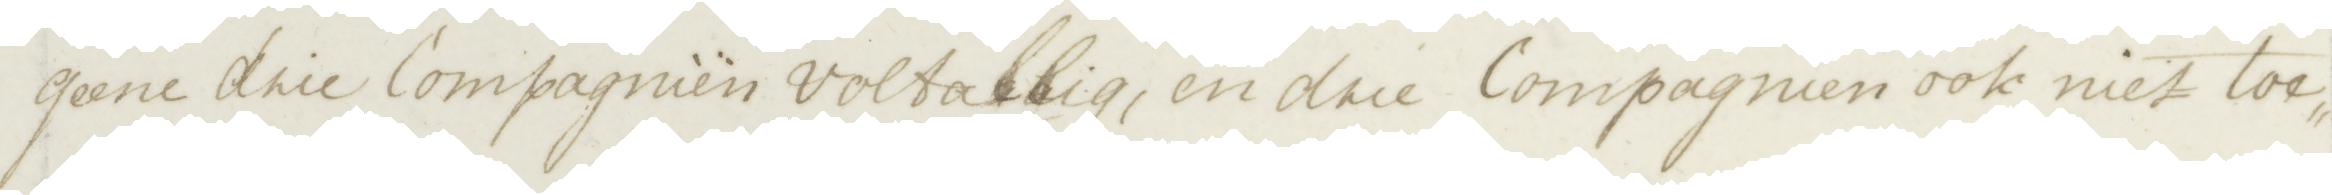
geene drie Compagniën voltallig, en drie Compagnien ook niet toe„
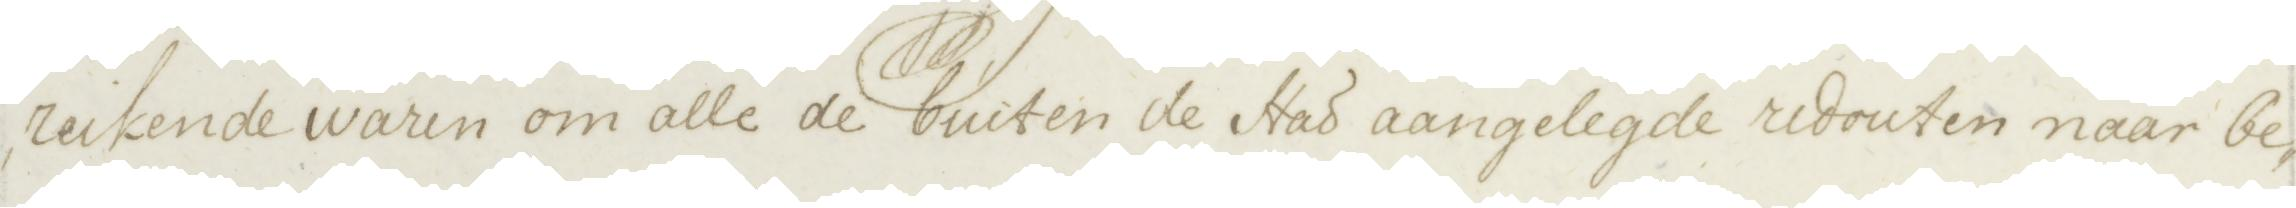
„reikende waren om alle de buiten de stad aangelegde redouten naar be
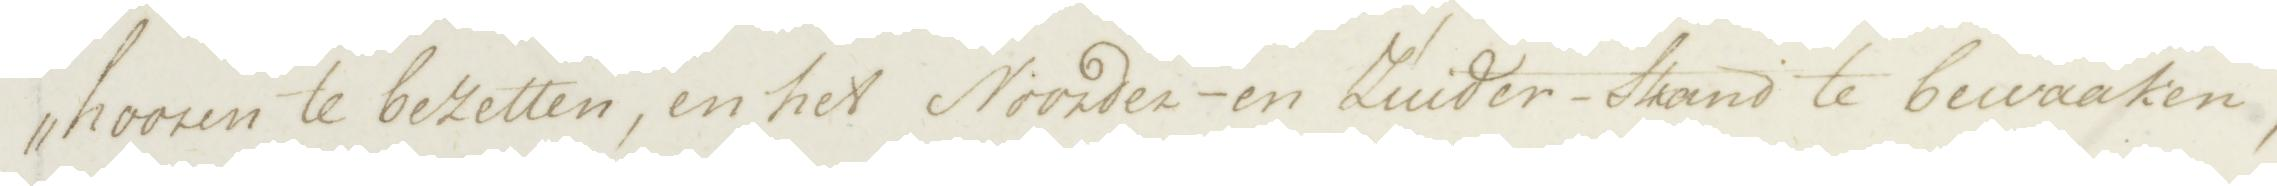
„hooren te bezetten, en het Noorder- en Zuider - Strand te bewaaken,
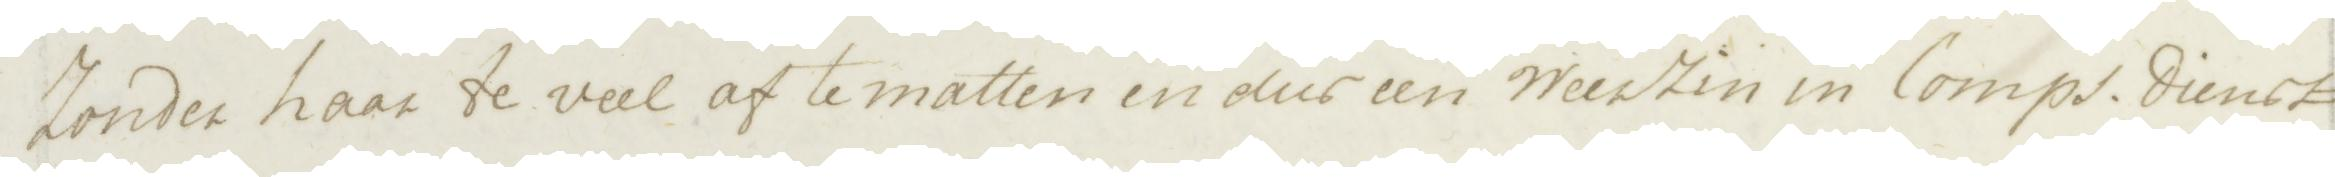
Zonder haar te veel af te matten en dus een weerzin in Comps. Dienst
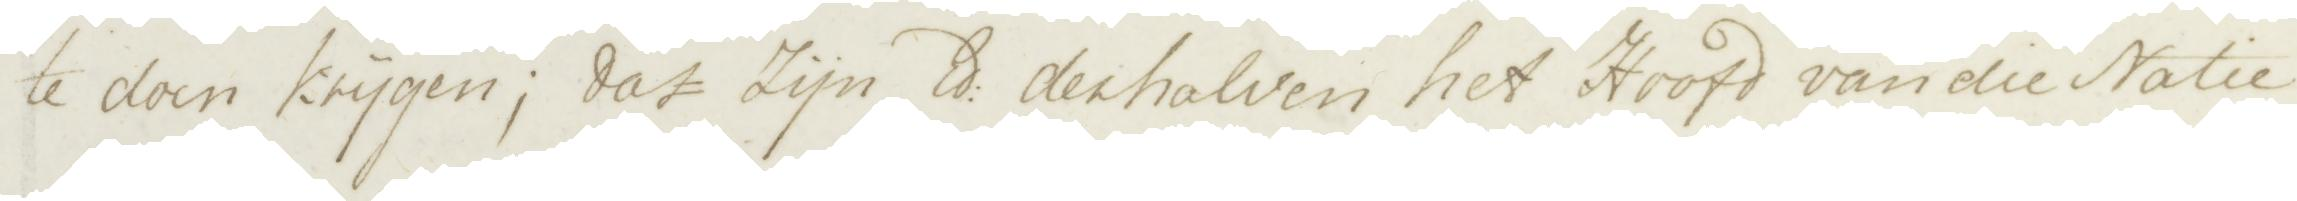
te doen krijgen; dat Zijn Ed: derhalven het Hoofd van die Natie
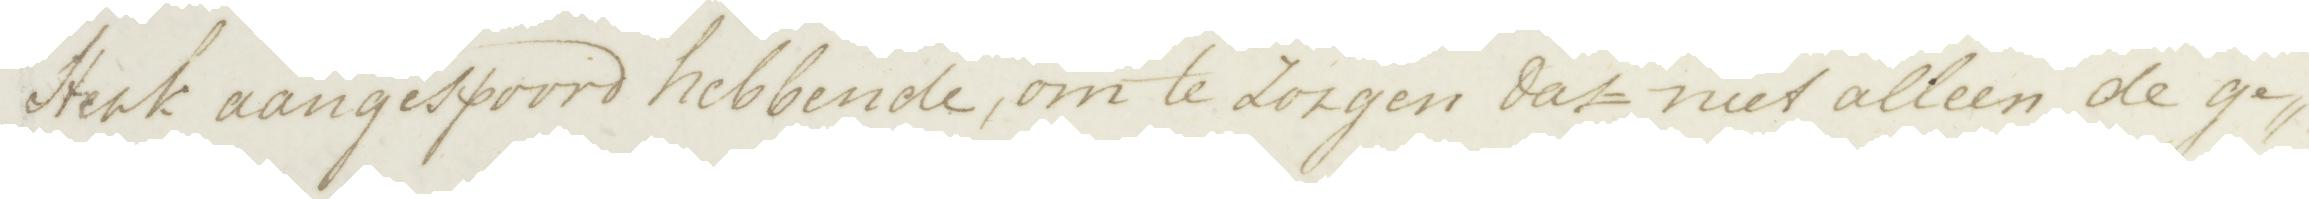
Sterk aangespoord hebbende, om te Zorgen dat niet alleen de ge„
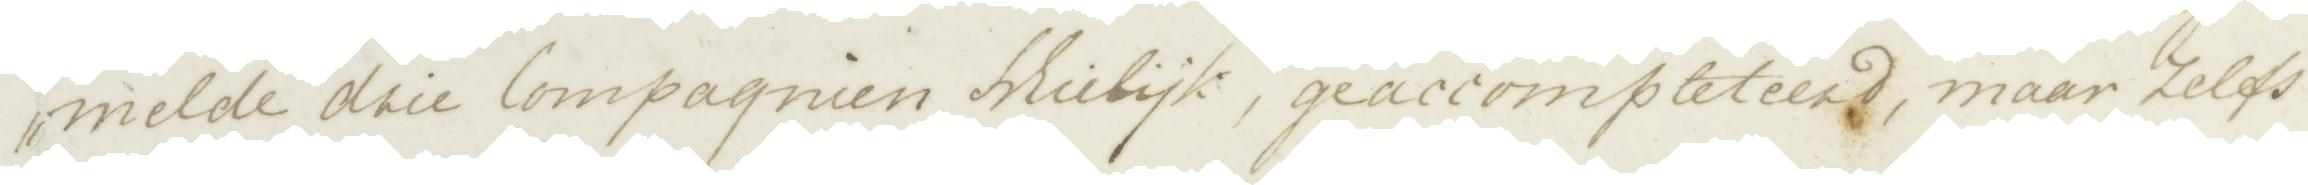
„melde drie Compagnien Schielijk, geaccompleteerd, maar zelfs
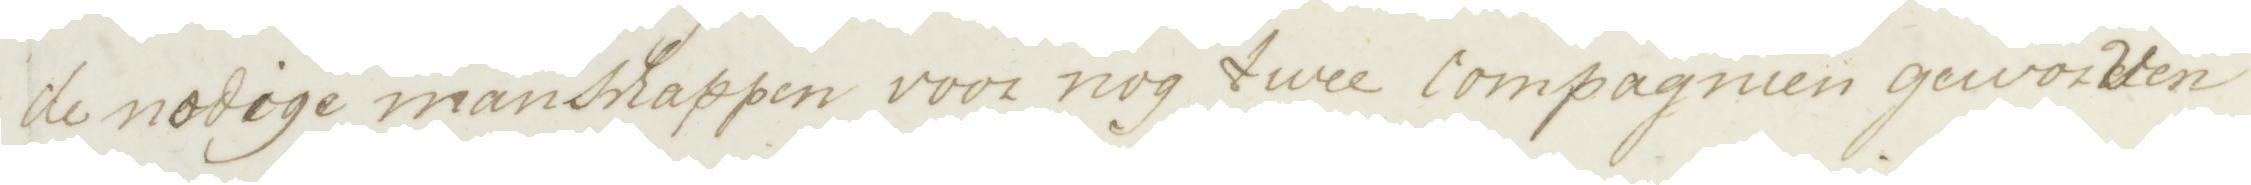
de nodige manschappen voor nog twee compagnien geworven
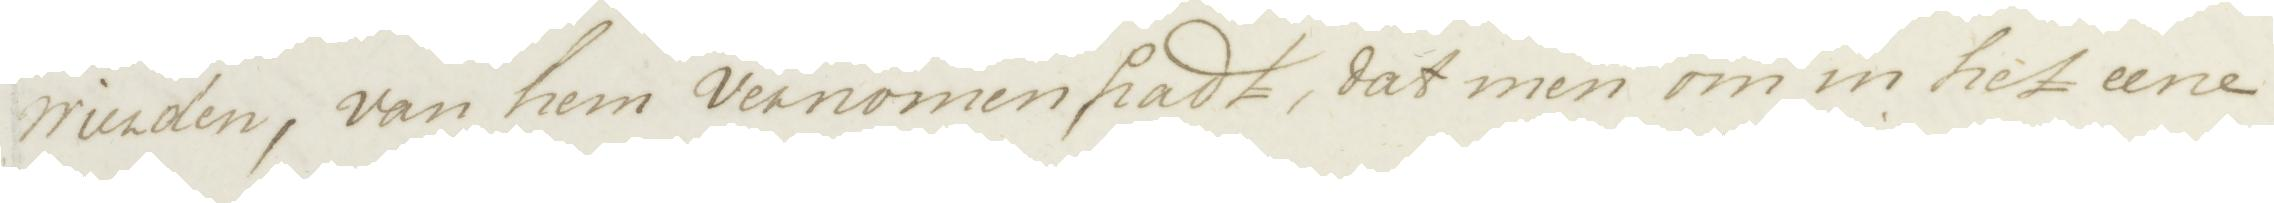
wierden, van hem vernomen hadt, dat men om in het eene
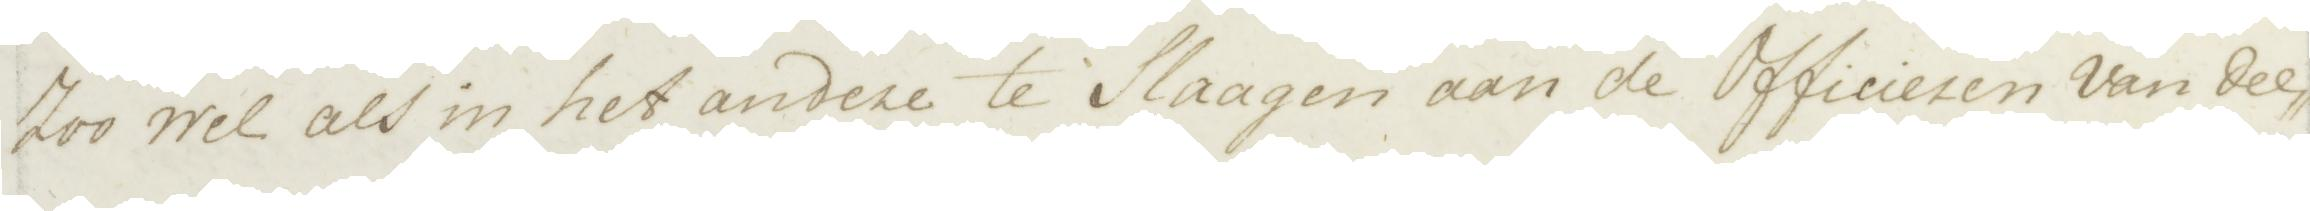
Zoo wel als in het andere te Slaagen aan de Officieren van dee„
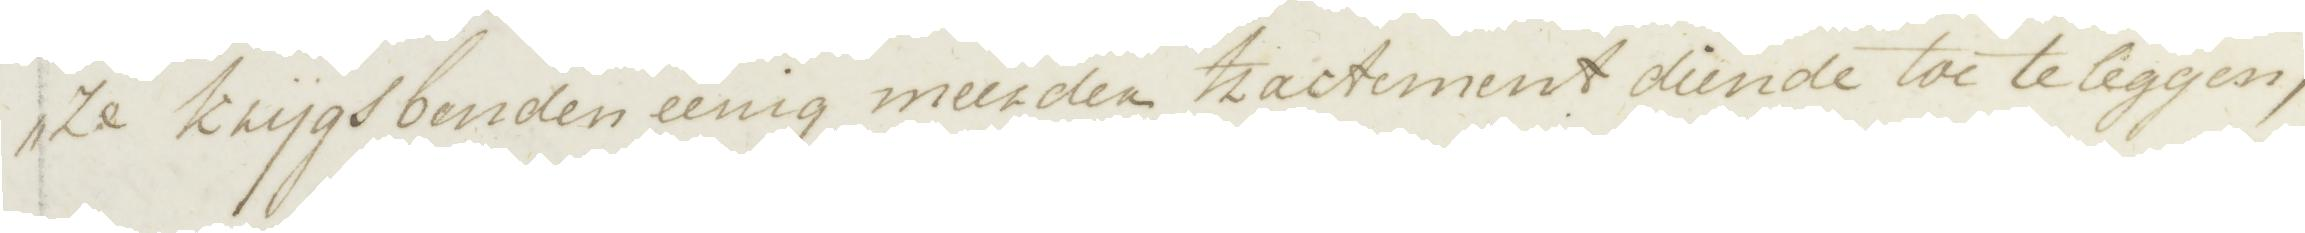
„Ze krijgsbenden eenig meerder tractement diende toe te leggen,
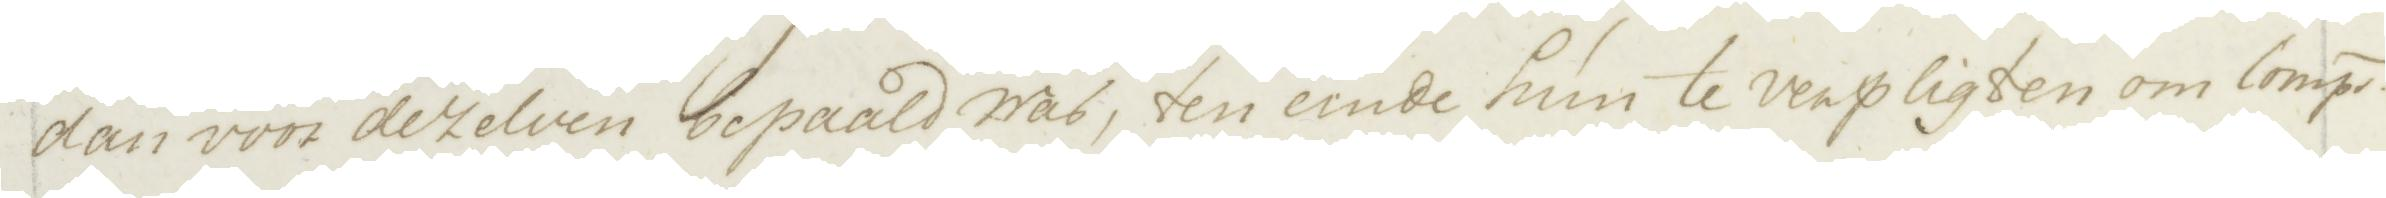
dan voor dezelven bepaald was, ten einde hun te verpligten om Comps.
